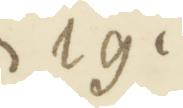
519.
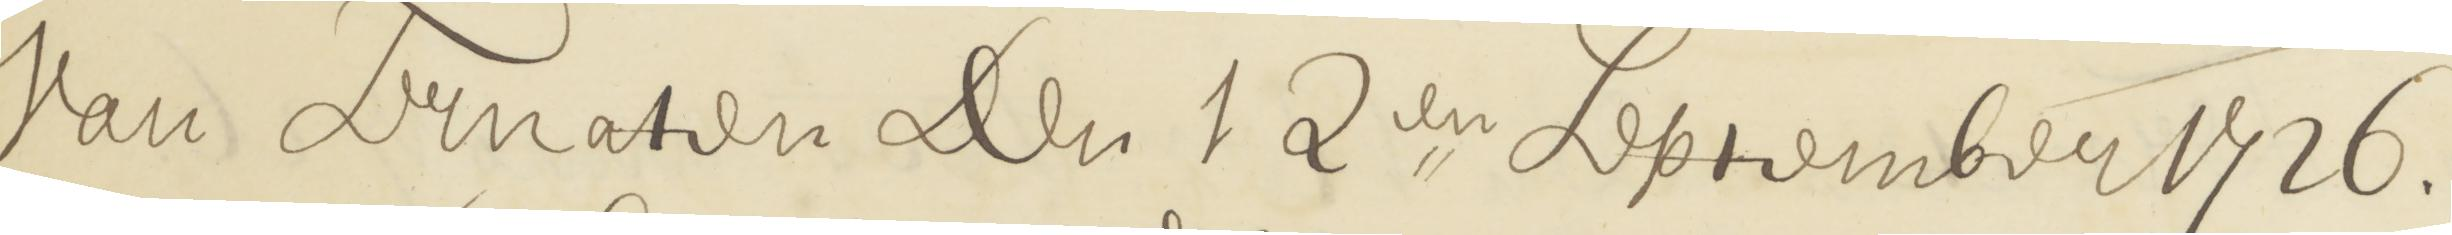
Van Ternaten Den 12„en September 1726.
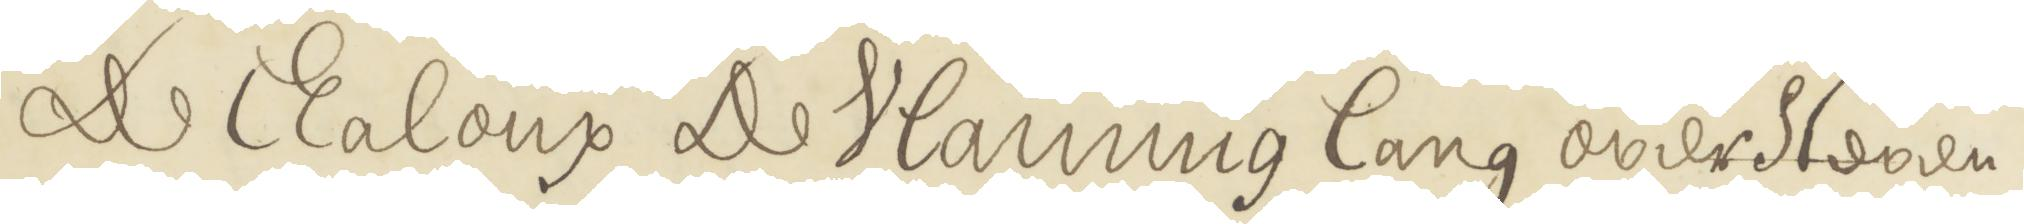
De Chaloup De Vlaming lang oversteven
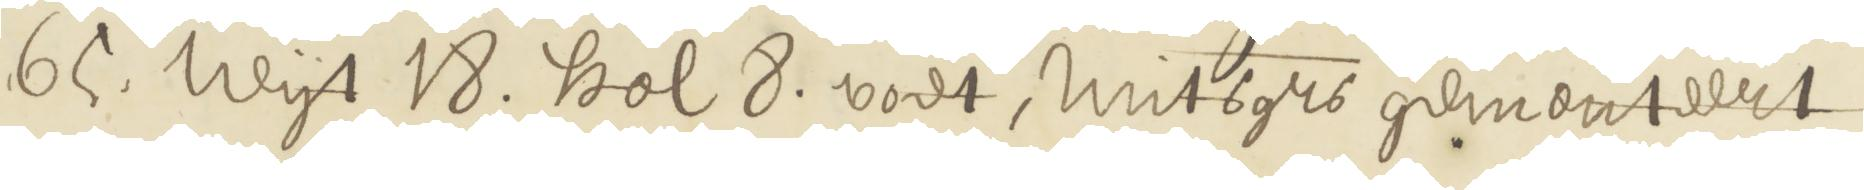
65: wijt 18. hol 8. voet, mitsgrs gemonteert
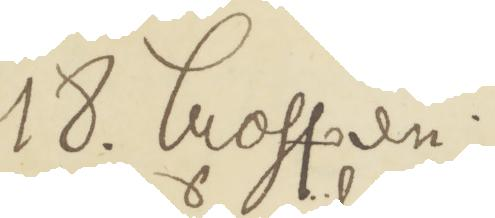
18. koppen.
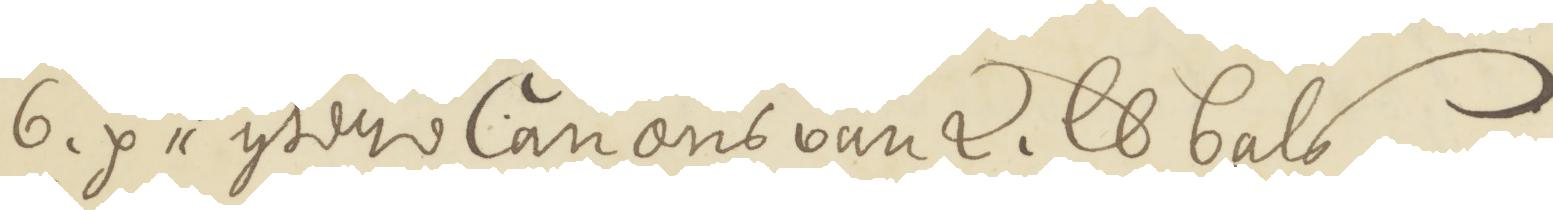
6. p„s ijsere Canons van 2. lb bals
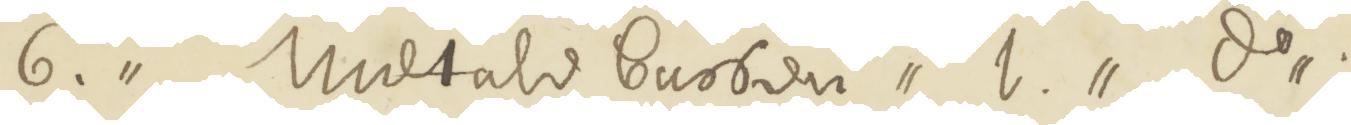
6. „ metale bassen „ 1. „ d„o.
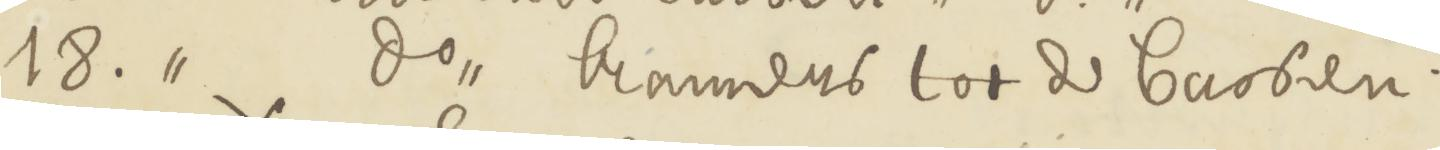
18. „ do „ kamers tot de bassen
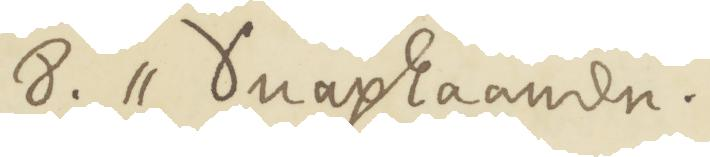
8. „ Snaphaanen.
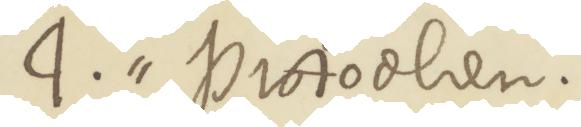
4. „ pistoelen.
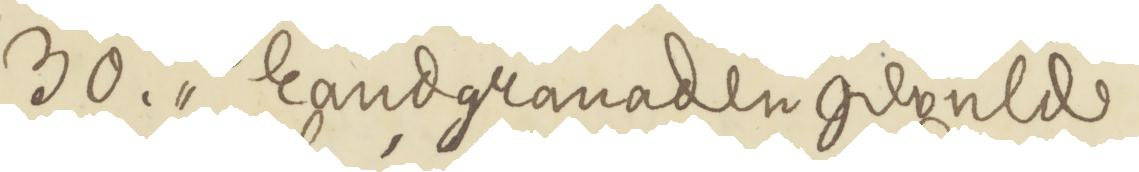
30. „ handgranaden gevulde.
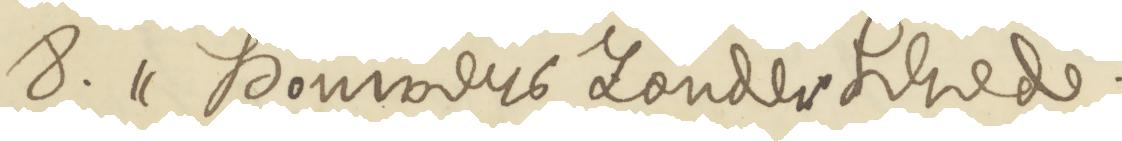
8. „ Houwers Zonder Schede.
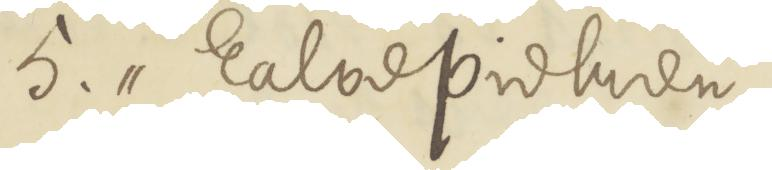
5. „ halve pieken.
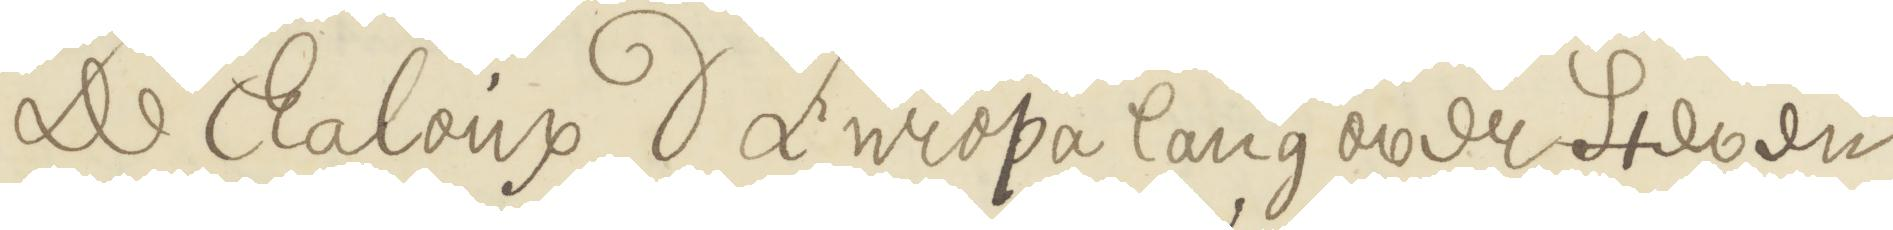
De Chaloup d Europa lang over Steven
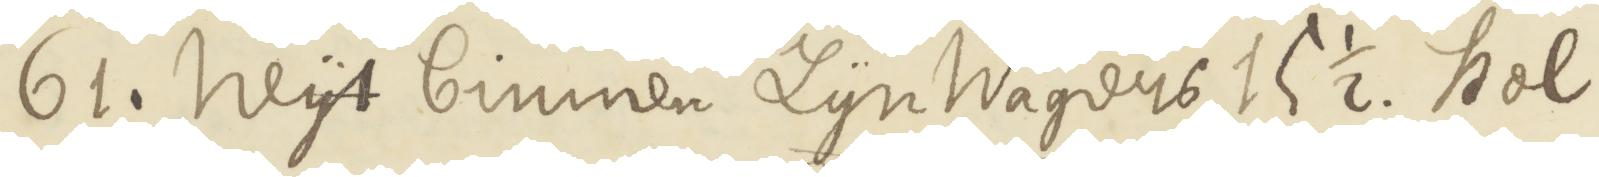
61. wijt binnen Zijn Wagers 15½. hol
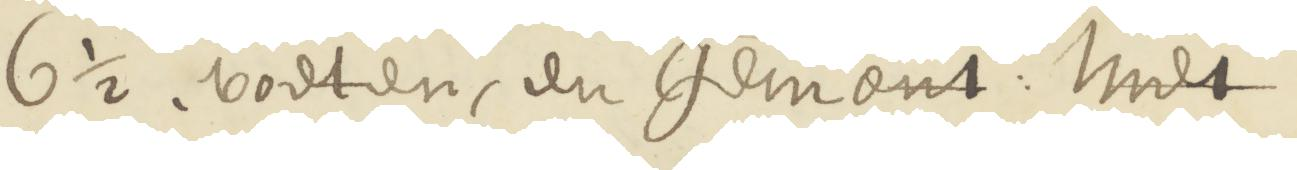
6½. voeten, en Gement: met
